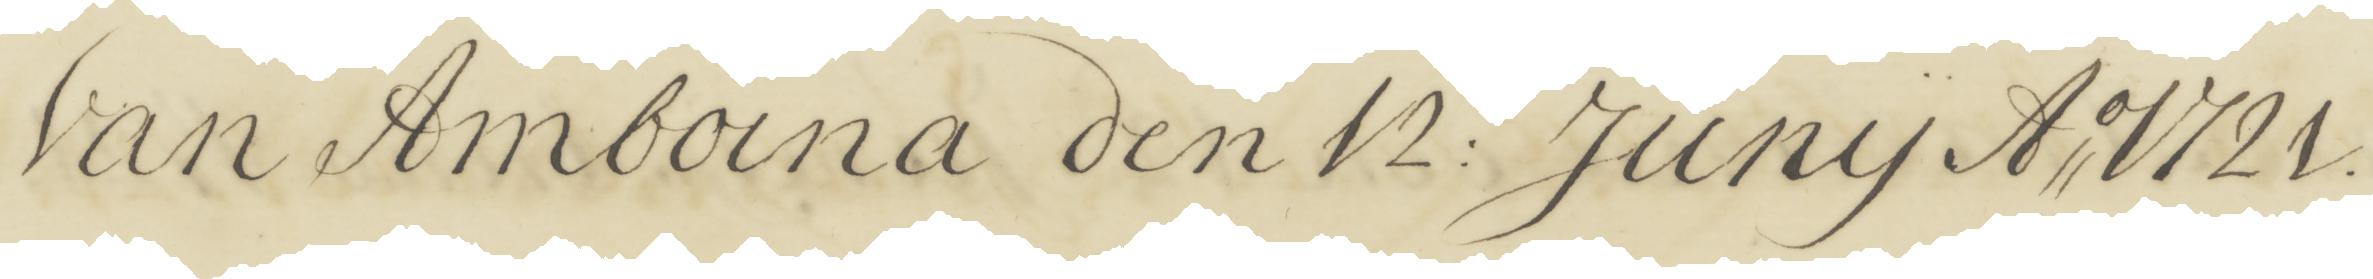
Van Amboina den 12:' Junij A„o 1721.
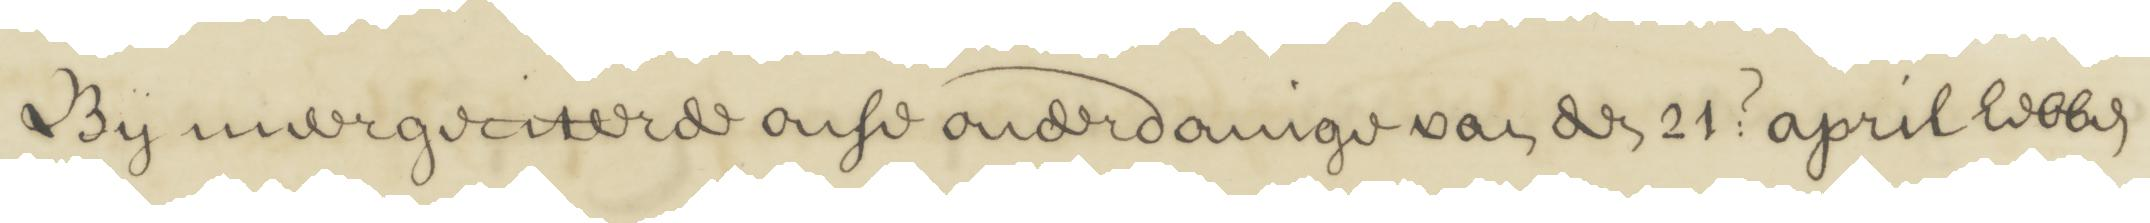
Bij meergeciteerde onse onderdanige van den 21:' april hebben
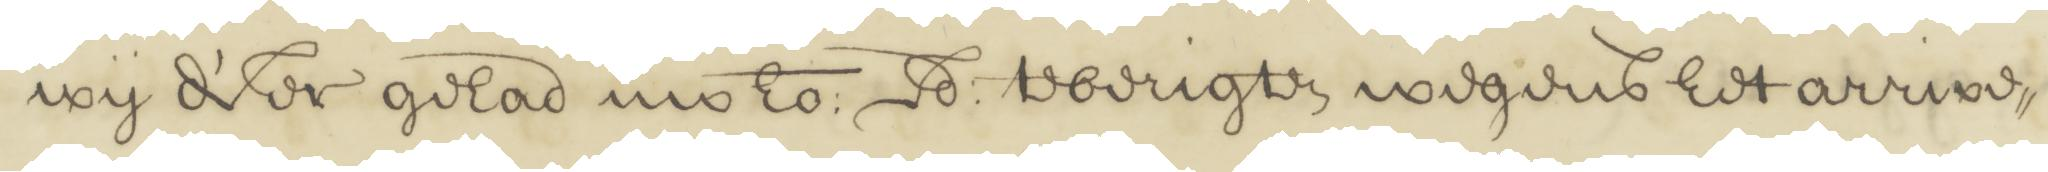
wij d'eer gehad uw ho: Ed: te berigten wegens het arrive„
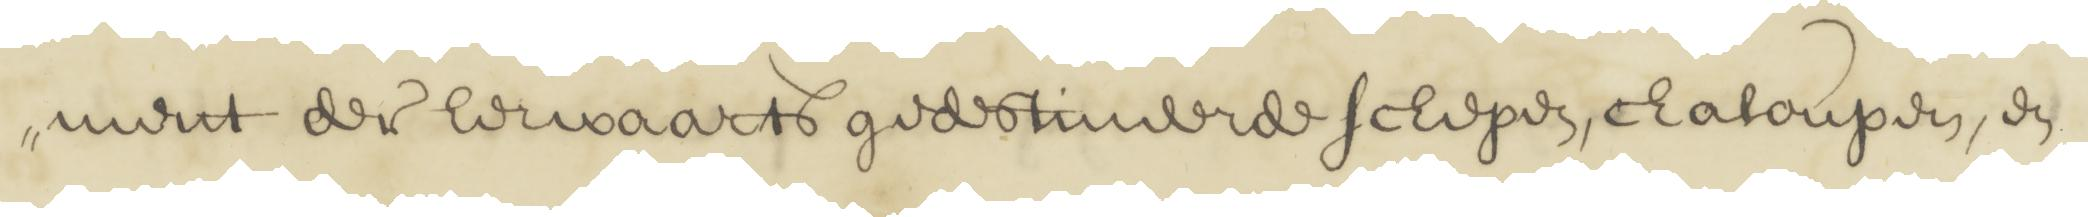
„ment der herwaarts gedestineerde schepen, chaloupen, en
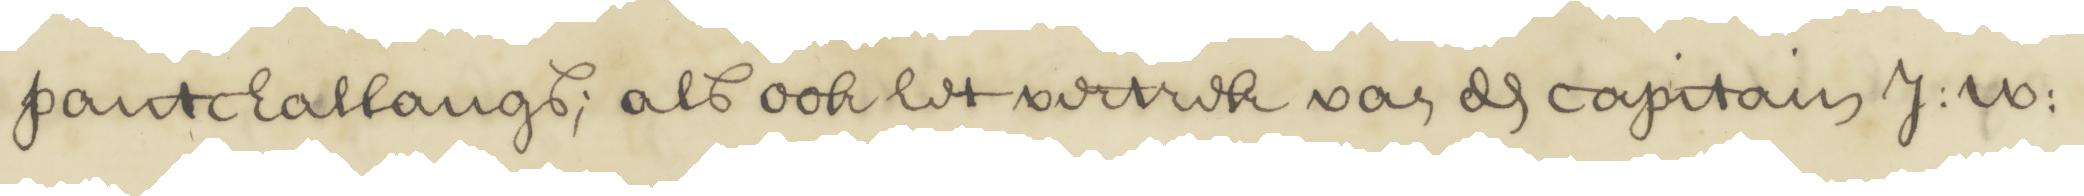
pantchallangs; als ook het vertrek van den capitain J: w:
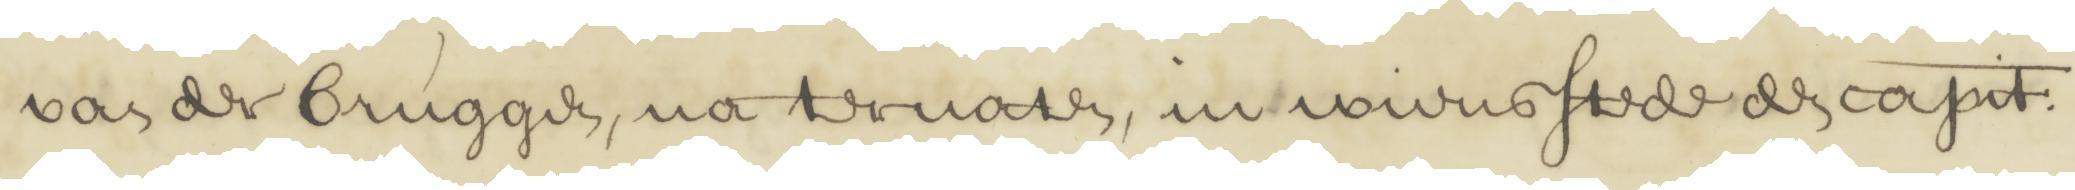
van der bruggen, na ternaten, in wiens stede den capit:
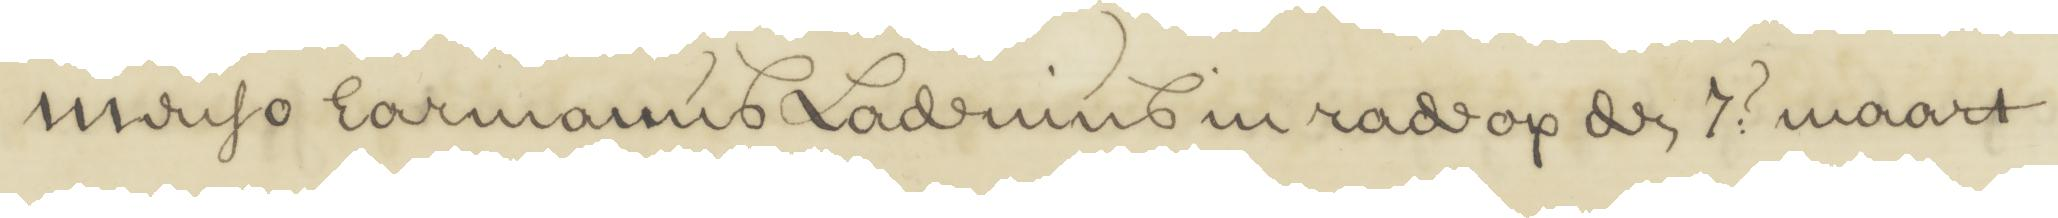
menso harmanus Ladenius in rade op den 7:' maart
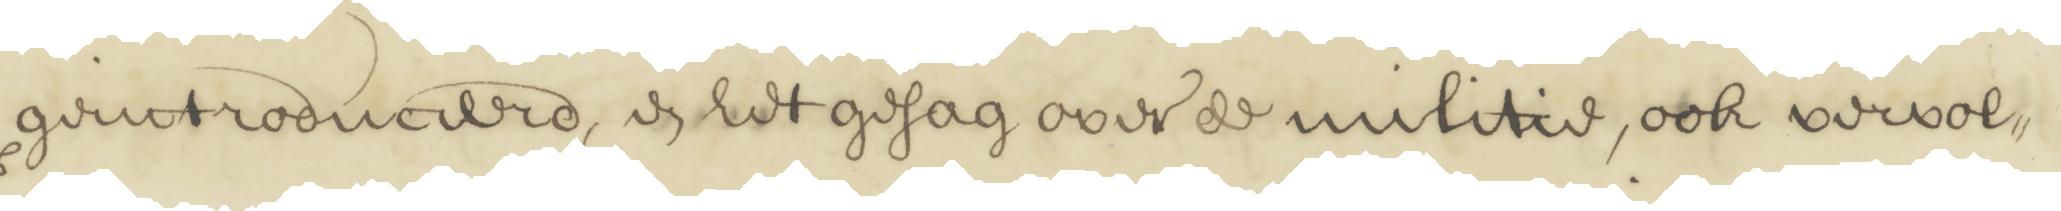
geintroduceerd, en het gesag over de militie, ook vervol„
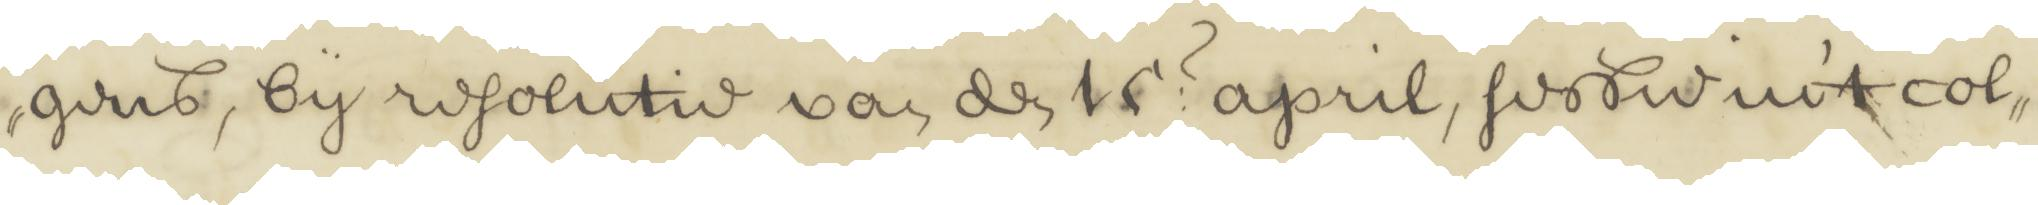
„gens, bij resolutie van den 15:' april, sessie in’t col„
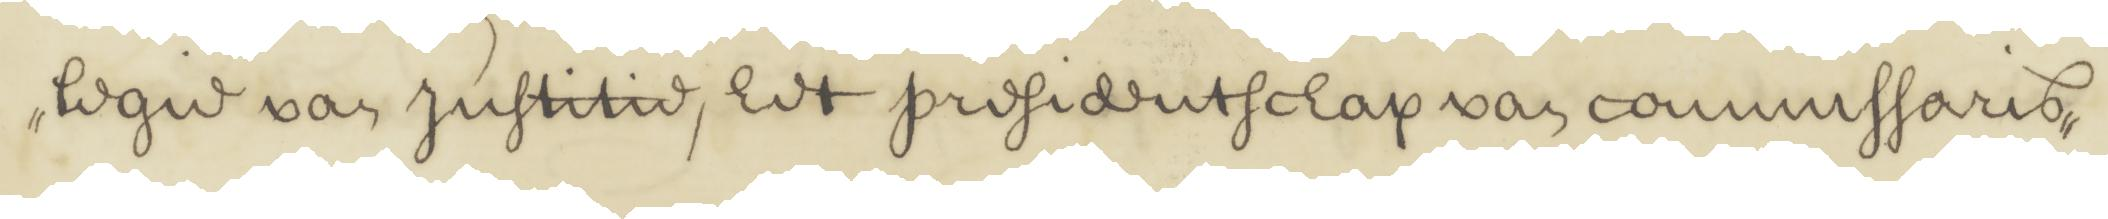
„legie van Justitie, het presidentschap van commissaris„
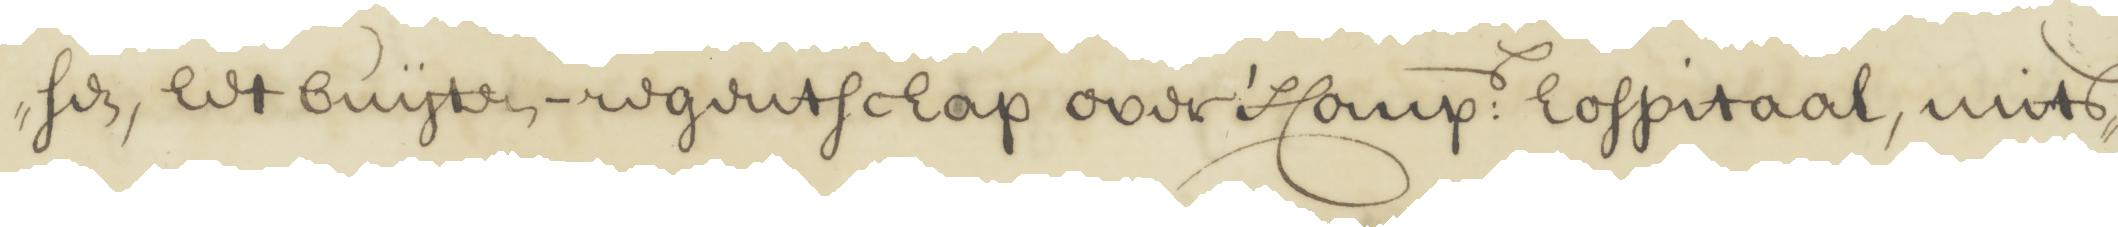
„sen, het buijten-regentschap over ’s Comp:s hospitaal, mits„
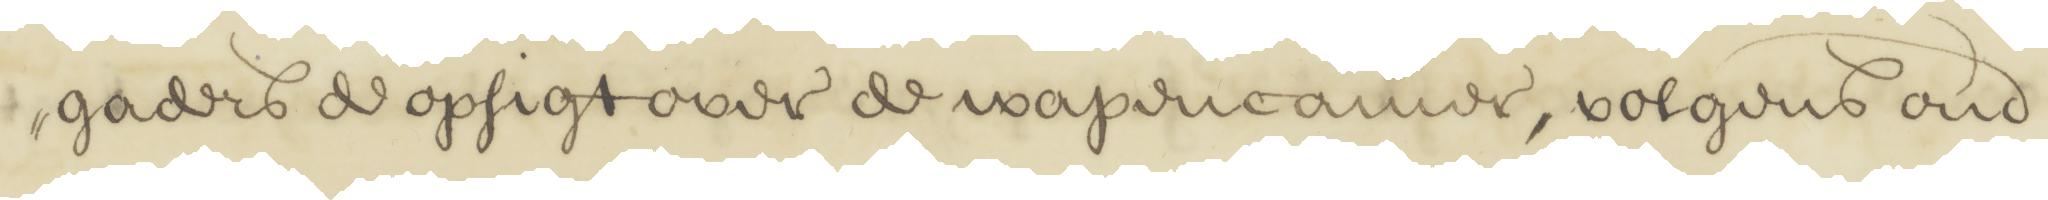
„gaders de opsigt over de wapencamer, volgens oud
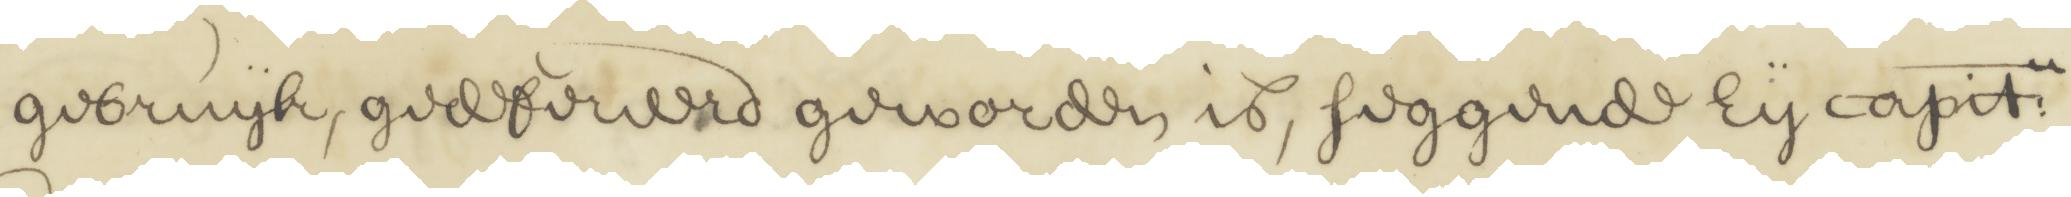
gebruijk, gedefereerd geworden is, seggende hij capit:n
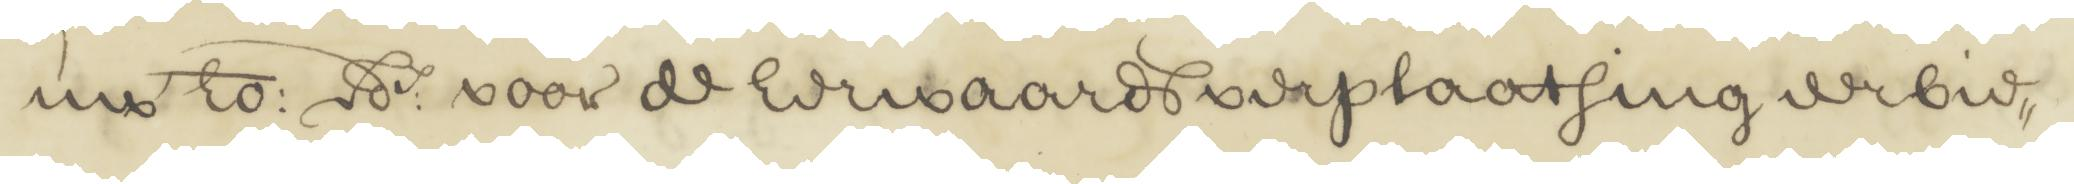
uw ho: Ed:s voor de herwaards verplaatsing eerbie„
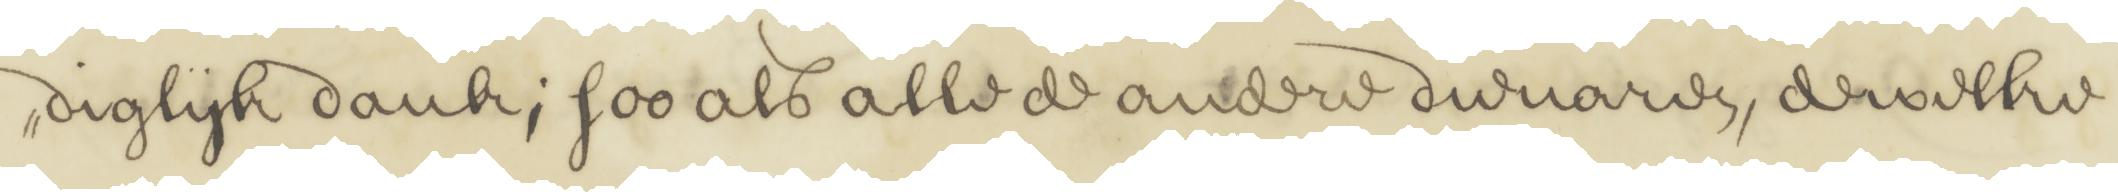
„diglijk dank; soo als alle de andere dienaren, de welke
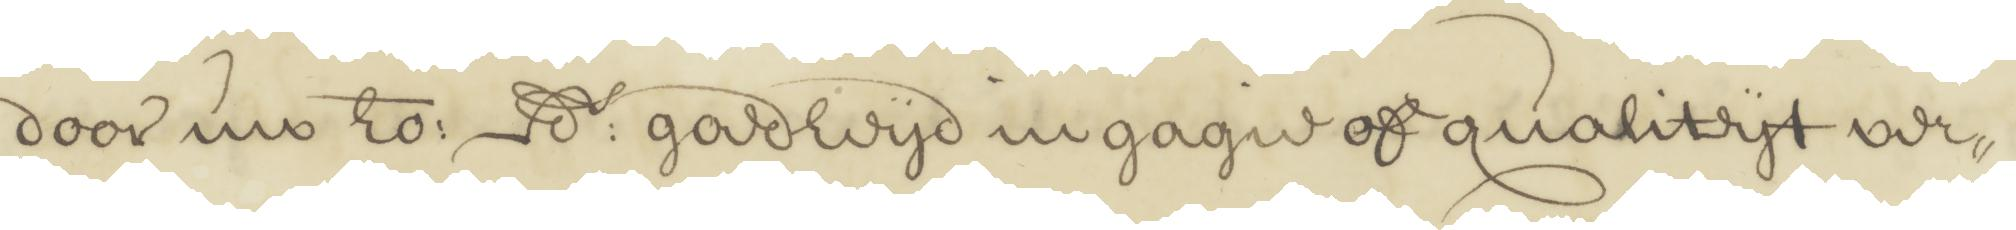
door uw ho: Ed:s goedheijd in gagie of qualiteijt ver„
